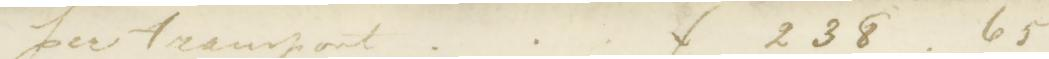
per Transport - - - ƒ 238 . 65
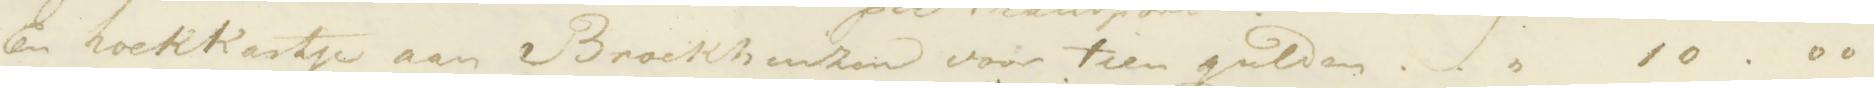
Een hoekkastje aan Broekhuizen voor tien gulden - - „ 10 . 00
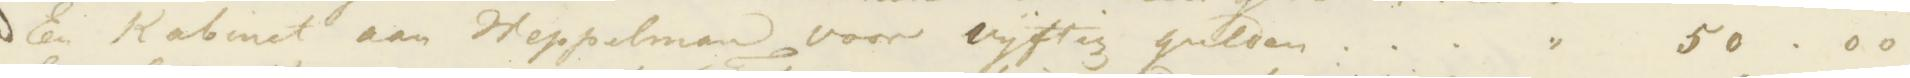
Een Kabinet aan Weppelman voor vijftig gulden - - - „ 50 . 00
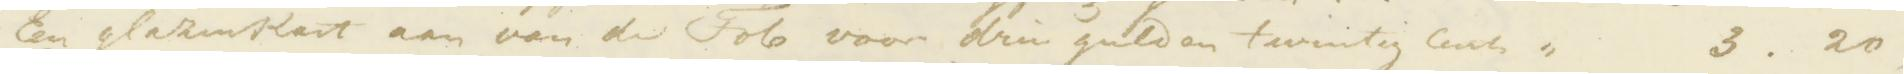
Een glazenkast aan van de Tol voor drie gulden twintig Cents „ 3 . 20
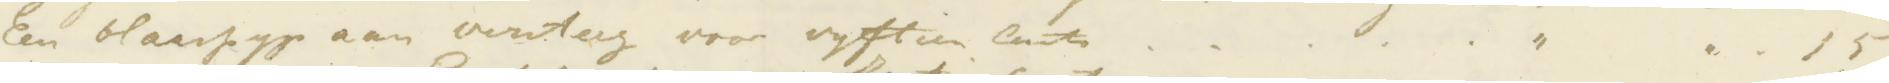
Een blaaspyjp aan Versteeg voor vyftien Cents - - - - - „ „ . 15
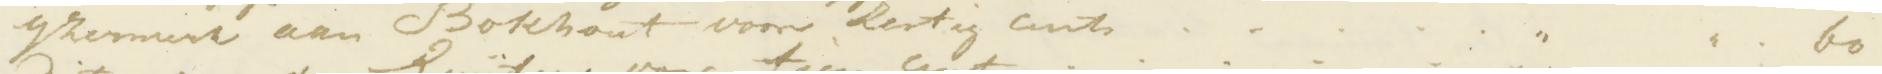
Yzerwerk aan Bokhout voor Zestig Cents „ „ 60
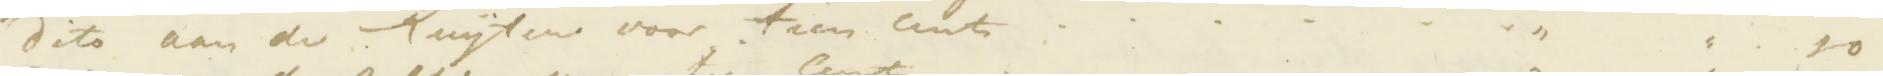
dito aan de Ruijten voor, tien Cent „ „ 10
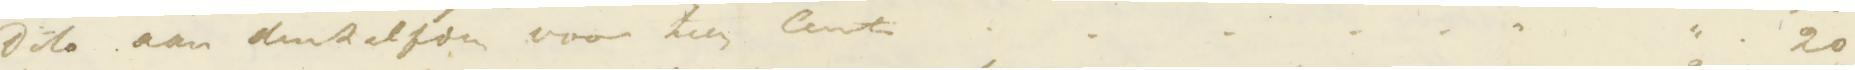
dito aan denzelfden voor tien Cent „ „ 20
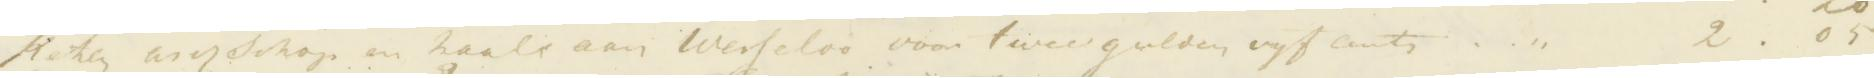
Reten anijschop en haals aan Wesseloo voor twee gulden vijf cents „ 2.05
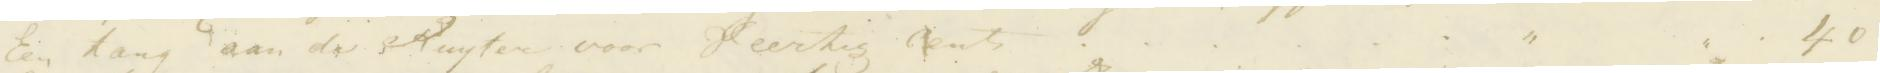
Een lang aan de Ruijter voor Veertig Cent „ „ 40
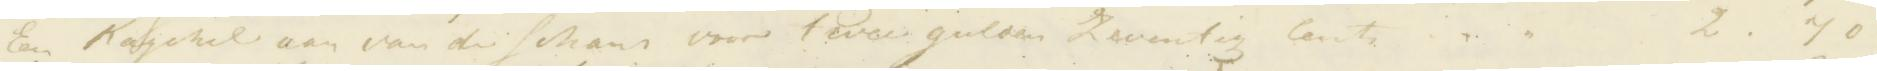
Een Kaijchel aan van de schans voor twee gulden Zeventig Cents „ 2.70
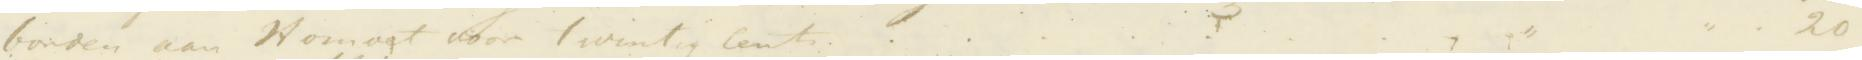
borden aan Womogt door twintig Cents „ „ 20
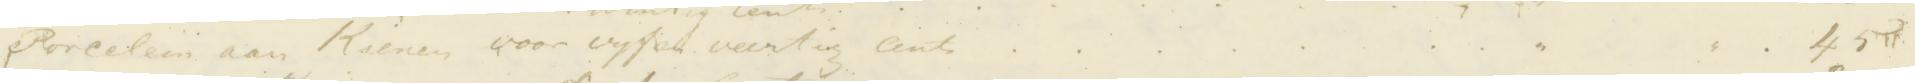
Porcelein aan Kienen voor vijfen veertig Cent „ „ 450
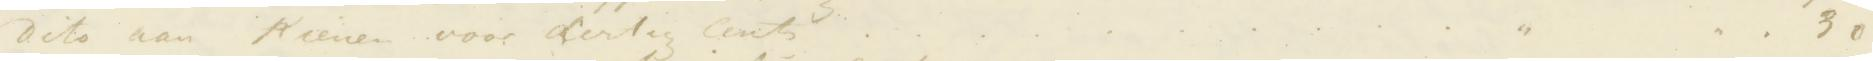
dito aan Kienen voor dertig Cents „ „ 30
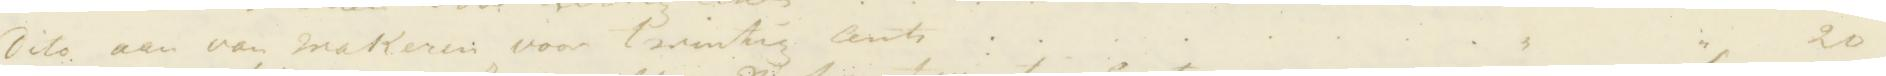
dito aan van wakeren voor twintig Cents „ „ 20
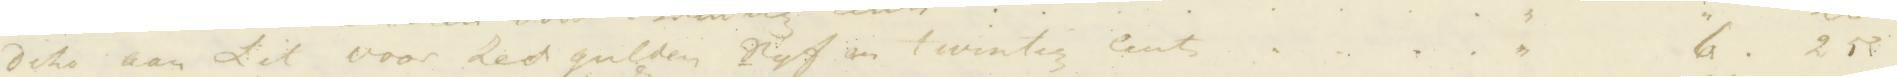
dito aan Lit voor Zes gulden Vijf en twintig Cent „ 6 252
